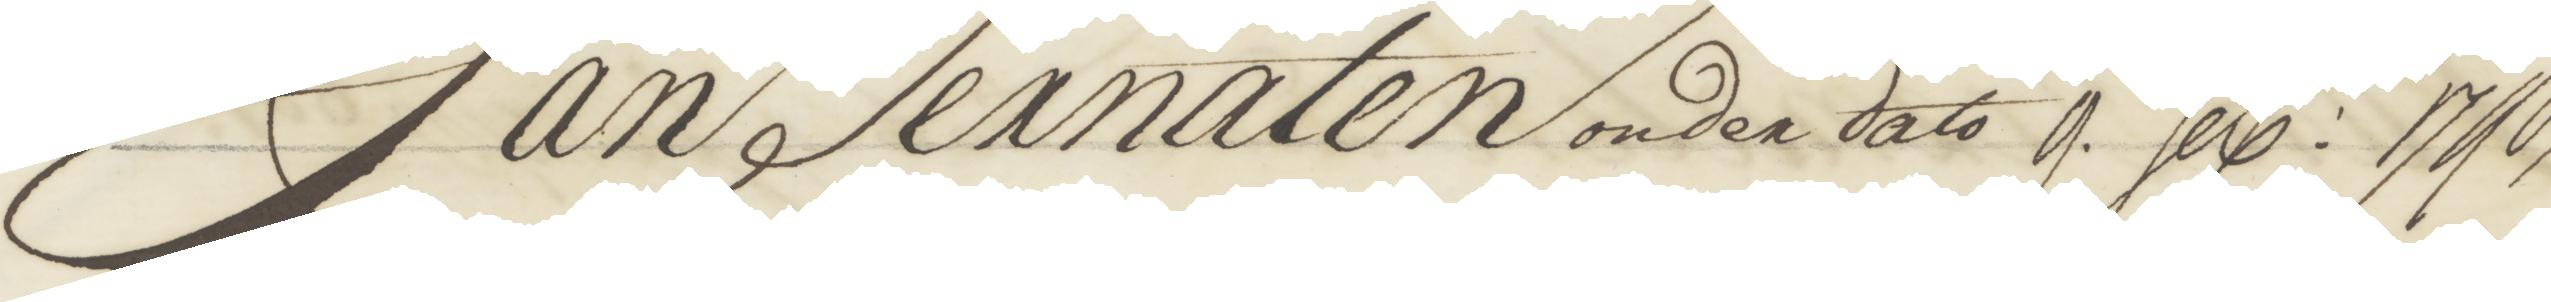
Van Ternaten onder dato 9. Sep: 1748
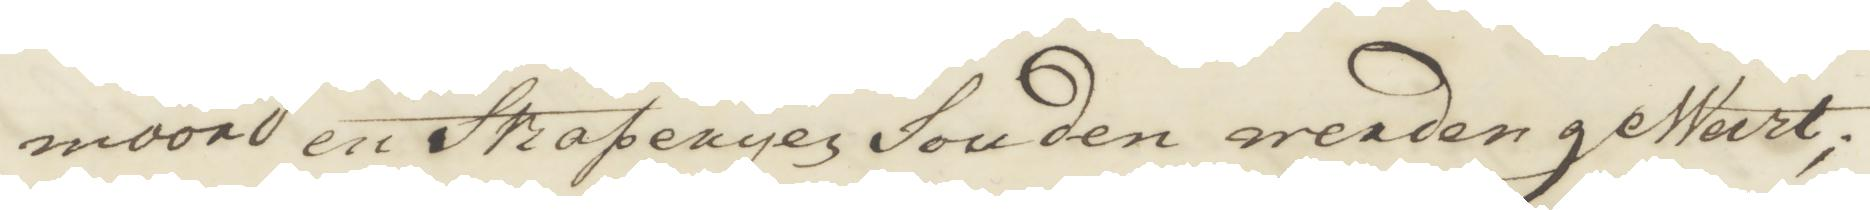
moord en stroperijen souden werden geweirt;
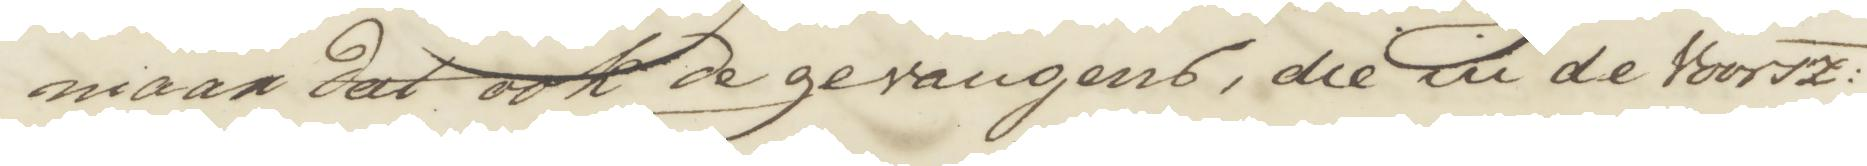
maar dat ook de gevangens, die in de voorsz:
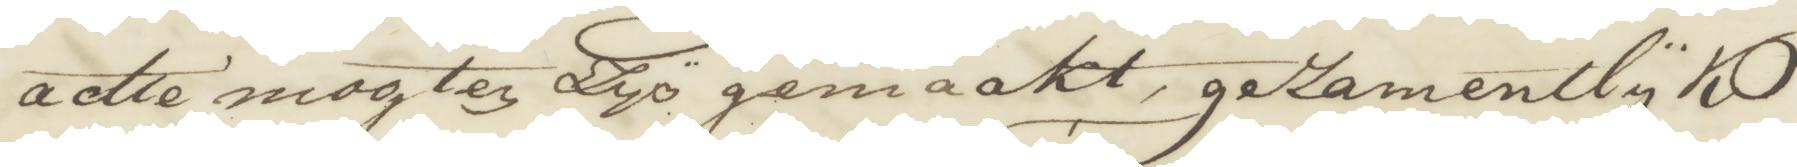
actie mogten zijn gemaakt, gezamentlijk
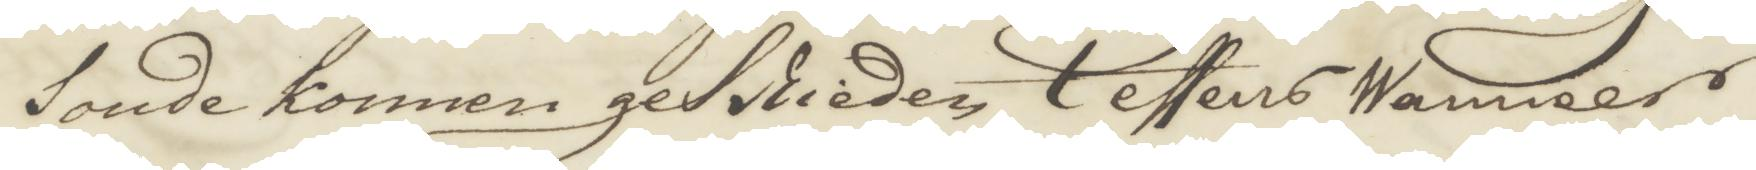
soude konnen geschieden 't effens wanneer
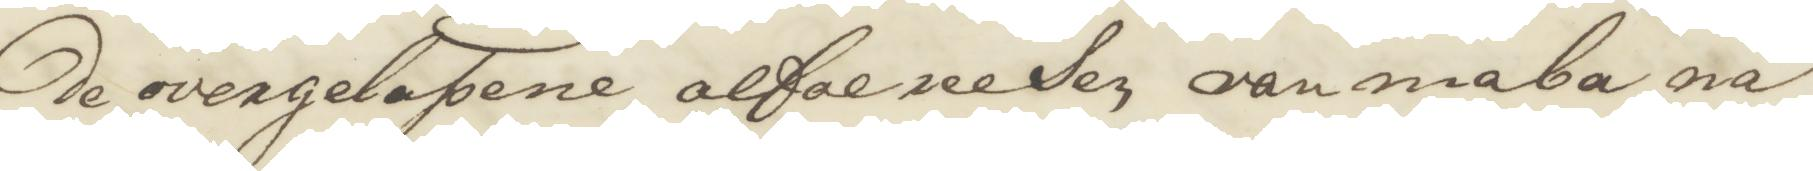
de overgelopene alfoereesen van maba na
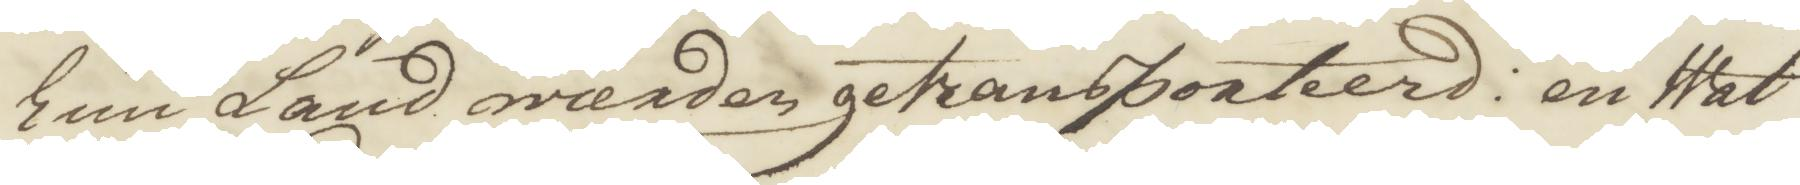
hun Land wierden getransporteerd: en wat
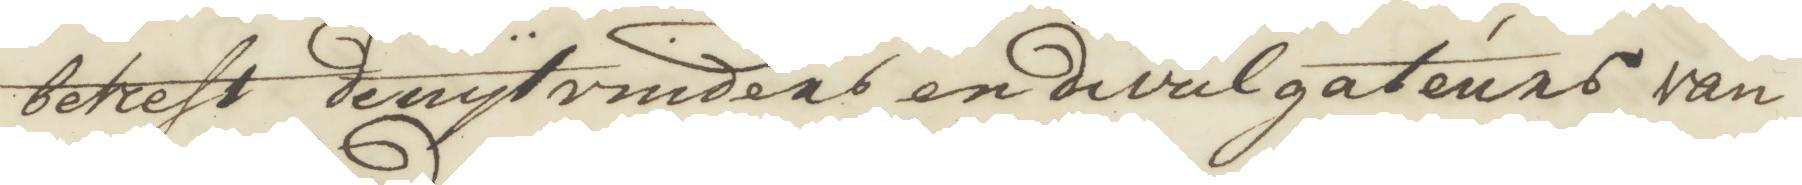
betrest de uijtvinders en divulgateurs van
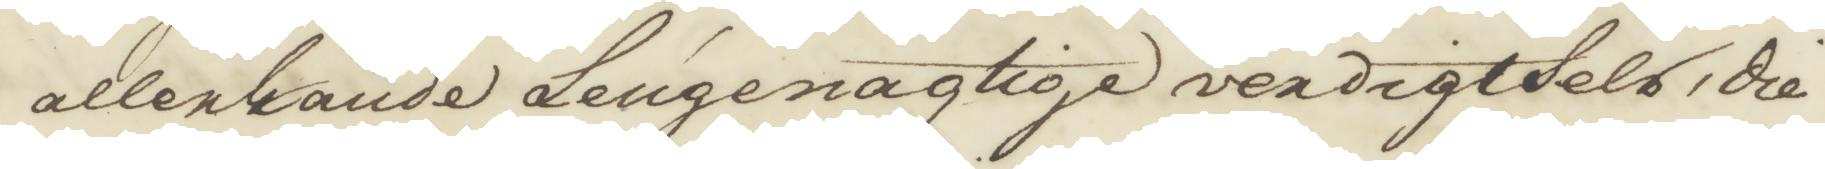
allerhande Leugenagtige verdigtsels, die
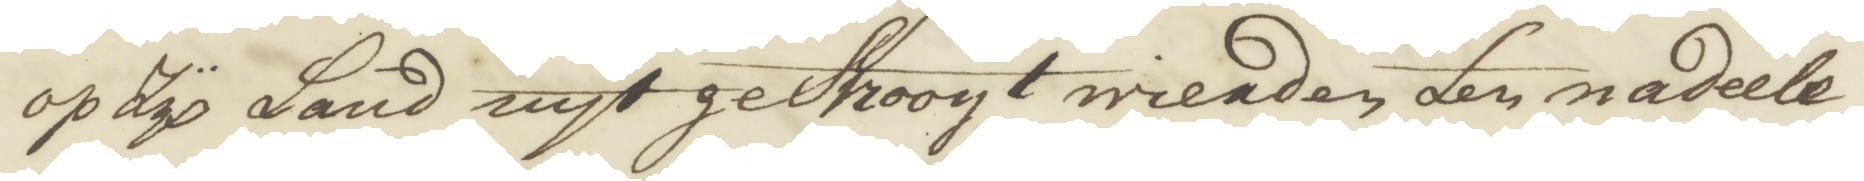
op zijn Land uijt gestrooijt wierden ten nadeele
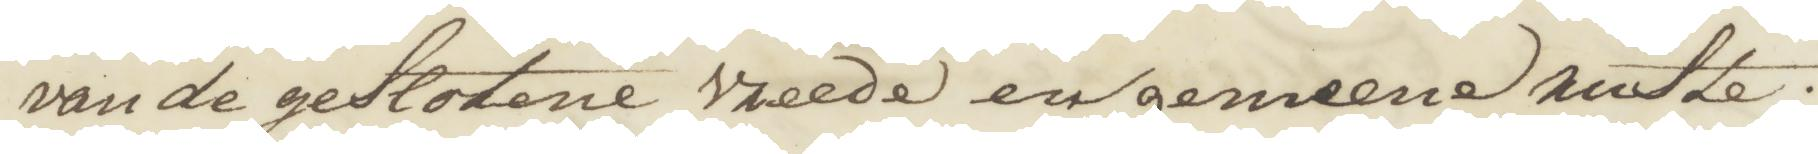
van de geslotene vreede en gemeene ruste;
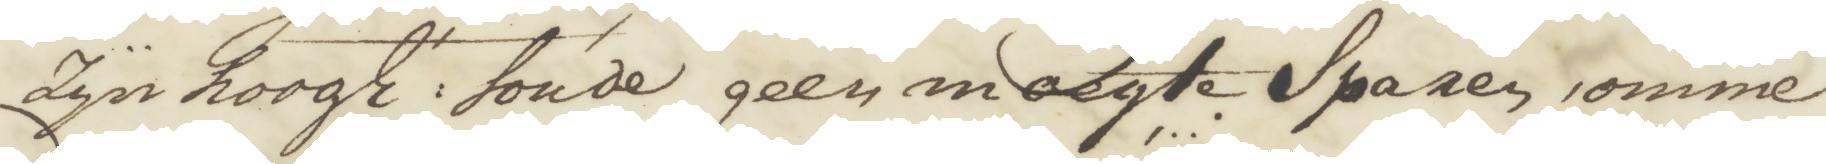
zijn hoogh:t soude geen moeijte sparen, omme
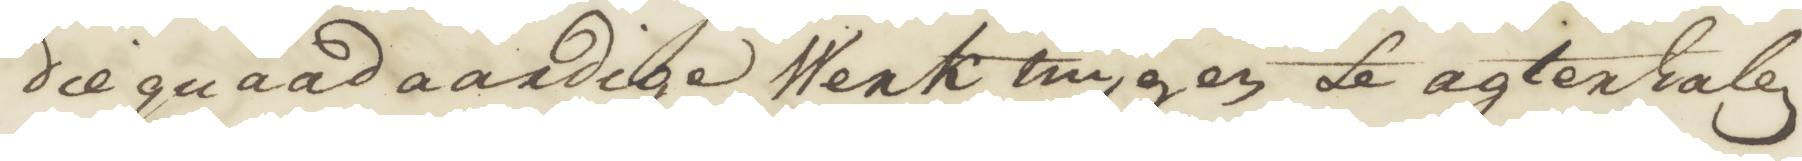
die quaadaardige werktuijgen te agterhalen
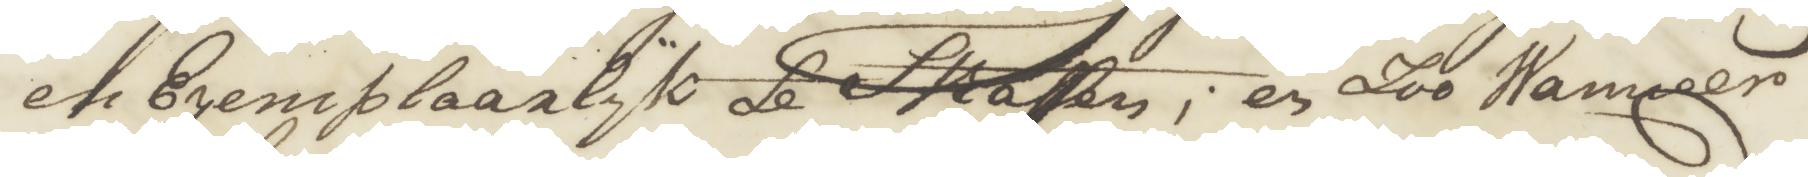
en Exemplaarlijk te straffen; en zoo wanneer
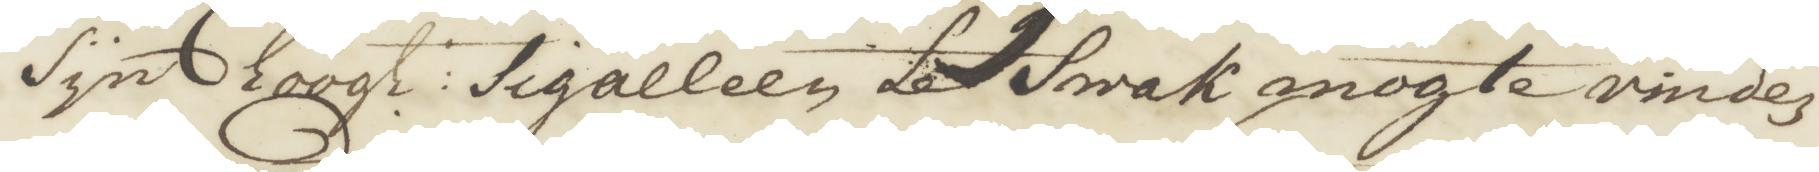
sijn hoogh:t sig alleen te swak mogte vinden
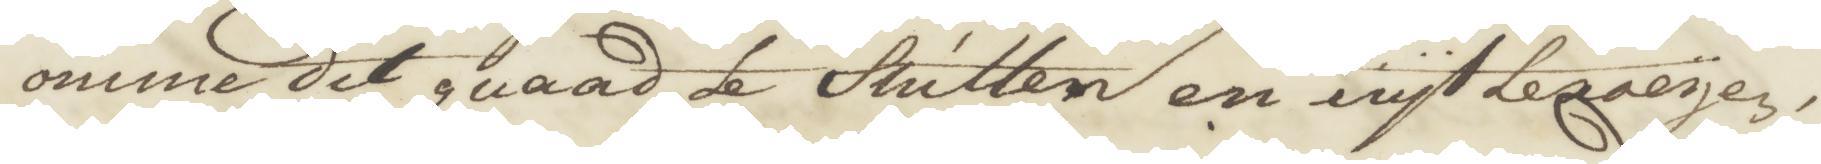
omme dit quaad te stutten en uijtteroeijen,
